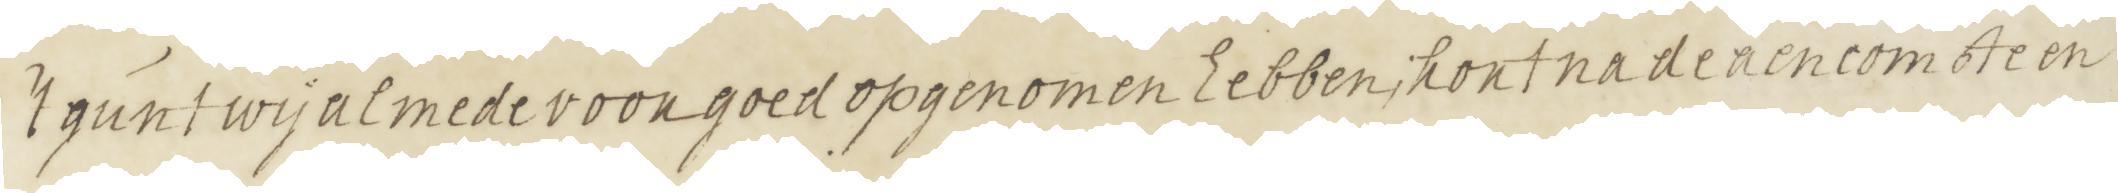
’t gunt wij almede voorgoed opgenomen hebben, kort na de aencomste en
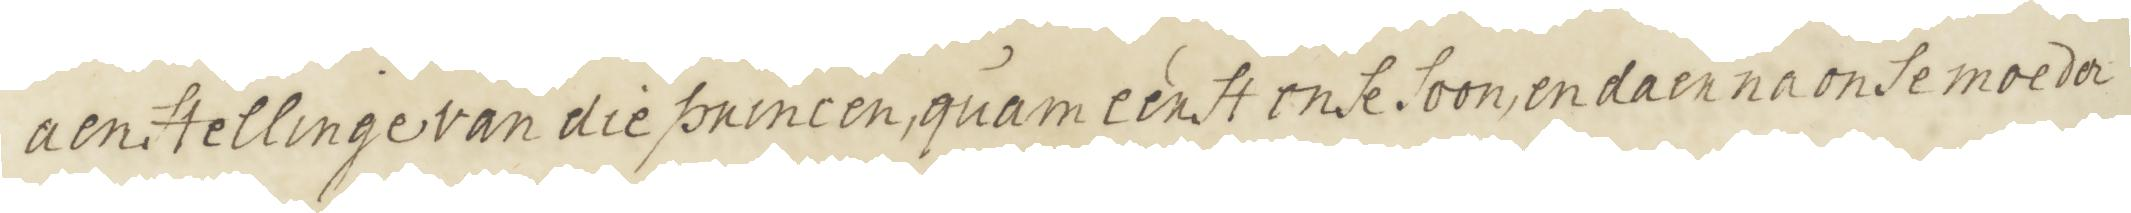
aenstellinge van die princen, quam eerst onse soon, en daer na onse moeder
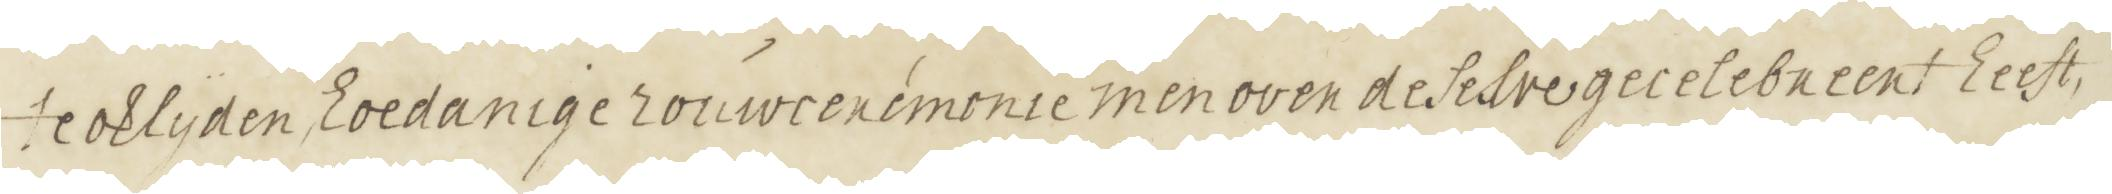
te overlijden, hoedanige rouwceremonie men over deselve gecelebreert heeft,
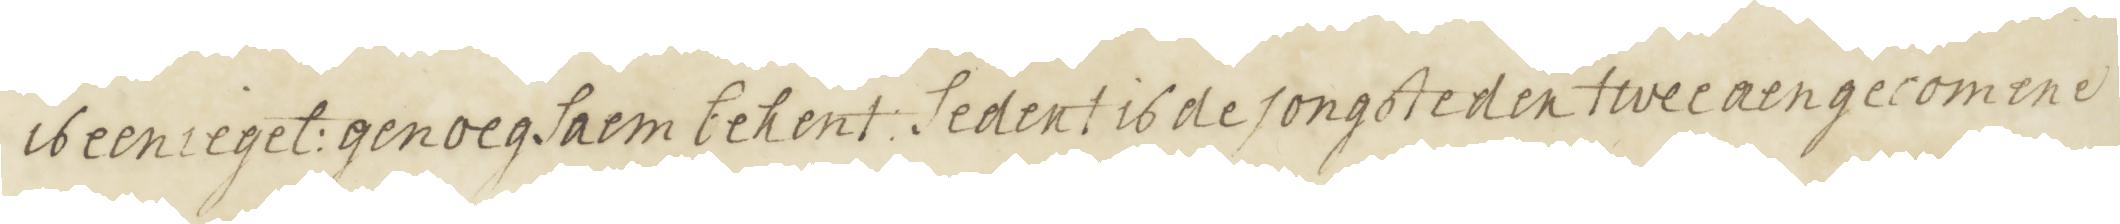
is eeniegelijk genoegsaem bekent: sedert is de jongste der twee aengecomene
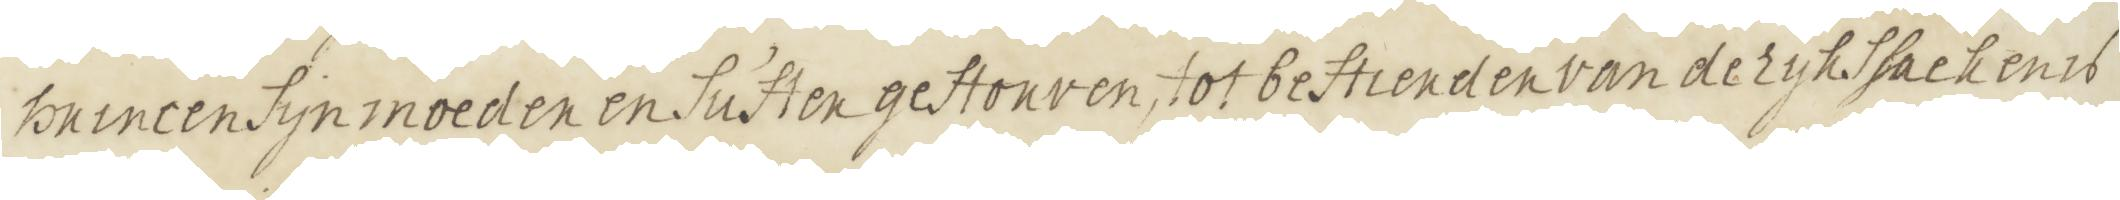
princen sijn moeder en suster gestorven, tot bestierder van de rykssaek en is
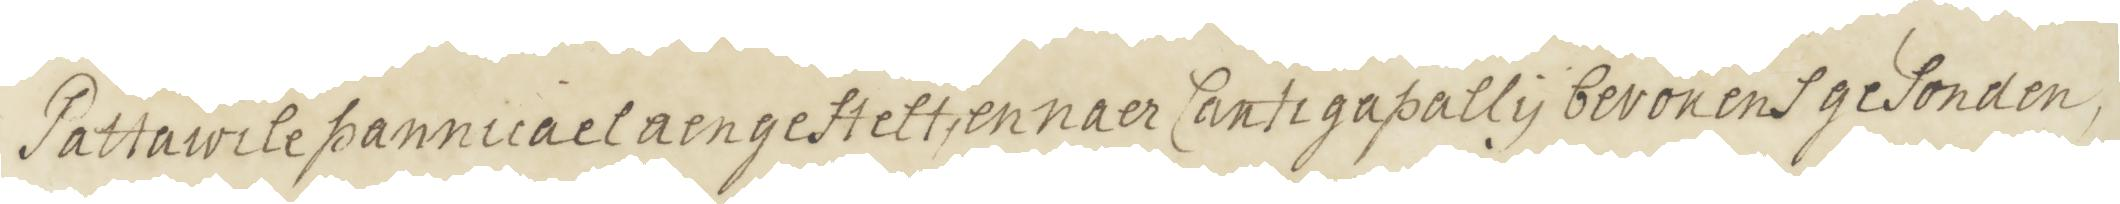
Pattawile pannicael aengestelt, en naer Cartigapallij bevorens gesonden,
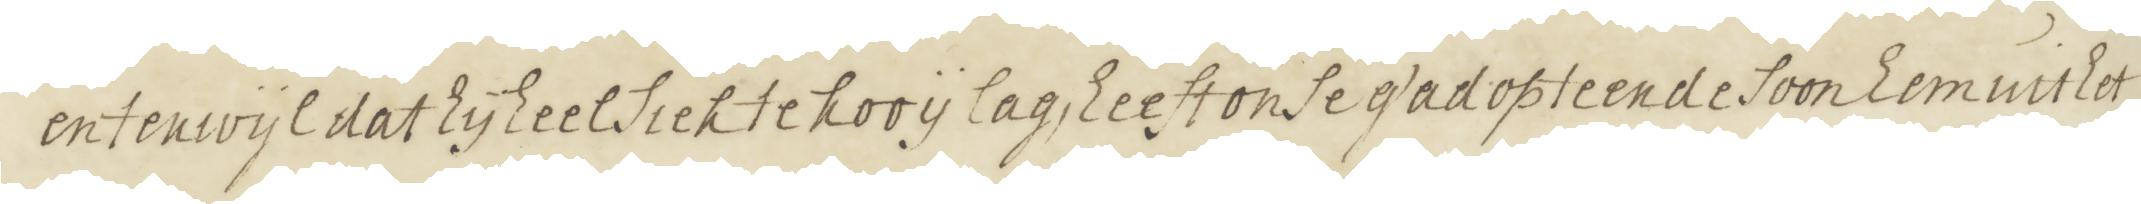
en terwijl dat hij heel siek te kooij lag, heeft onse g’adopteerde soon hem uit het
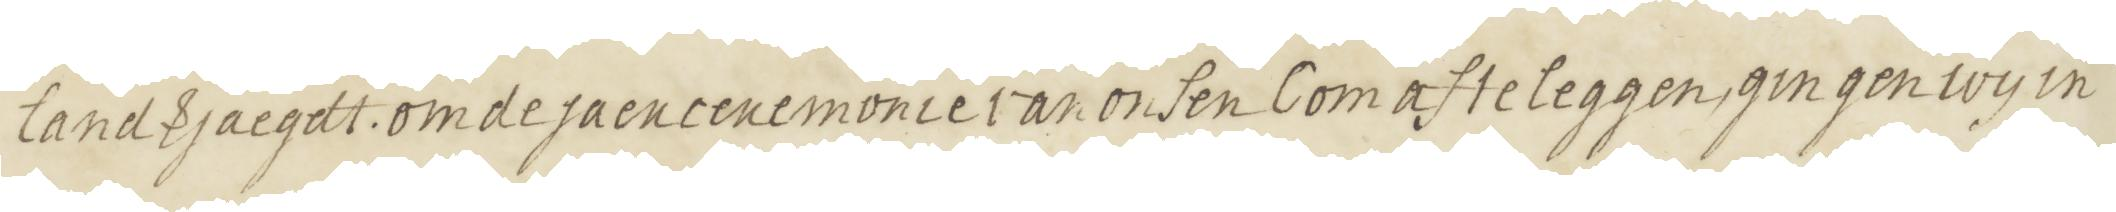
land verjaegdt. om de jaerceremonie van onsen Com afteleggen, gingen wij in
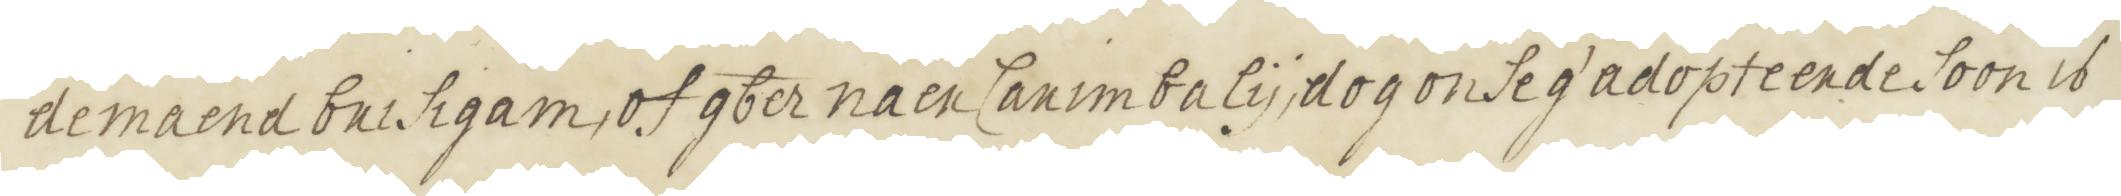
de maend bresigam, of 9ber naer Carimbalij, dog onse g’adopteerde soon is
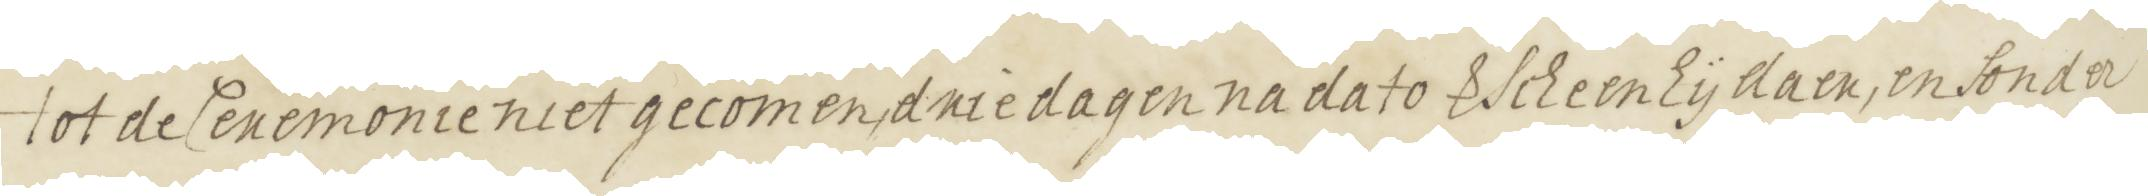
tot de Ceremonie niet gecomen, drie dagen na dato verscheen hij daer, en sonder
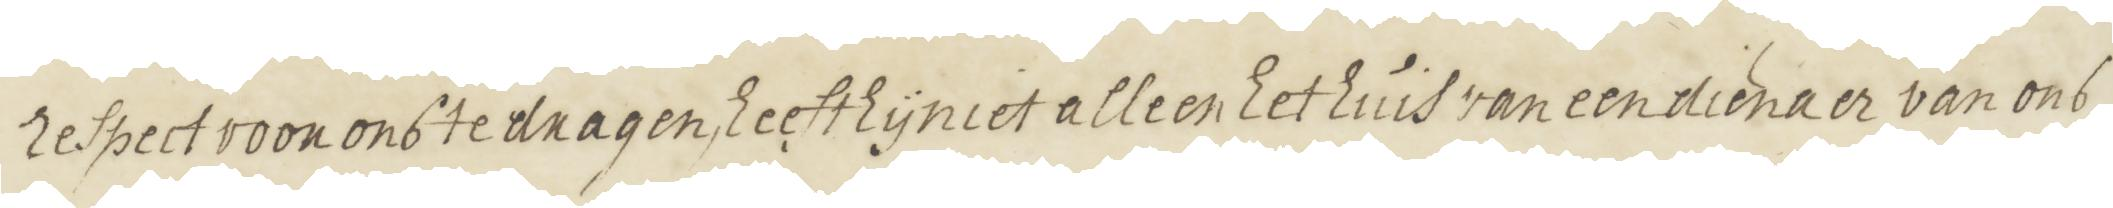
respect voor ons te dragen, heeft hij niet alleen het huis van een dienaer van ons
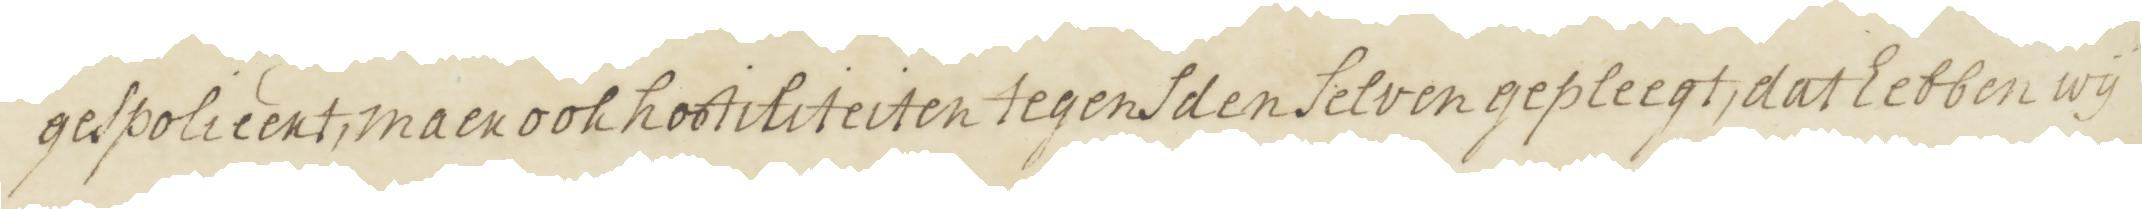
gespolieert, maer ook hostiliteiten tegens den selven gepleegt, dat hebben wij
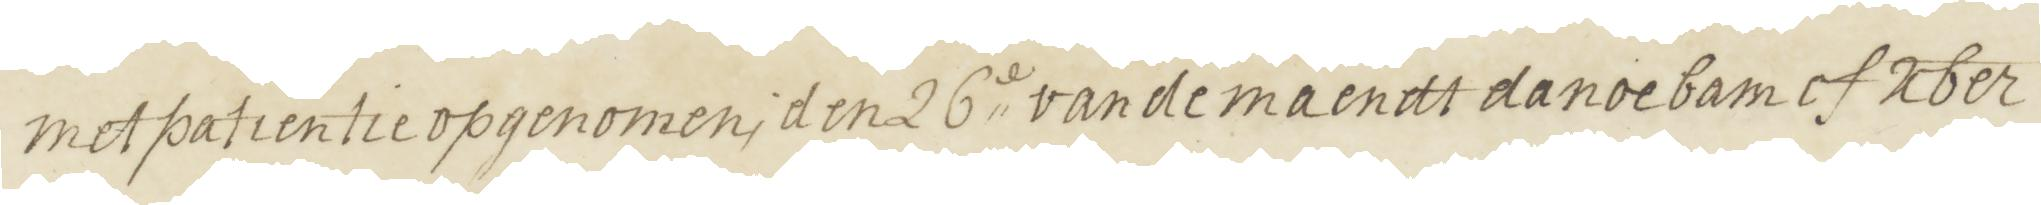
met patientie opgenomen; den 26„e van de maendt danoebam of xber
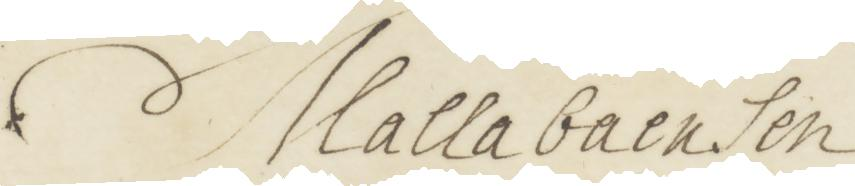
Mallabaersen
